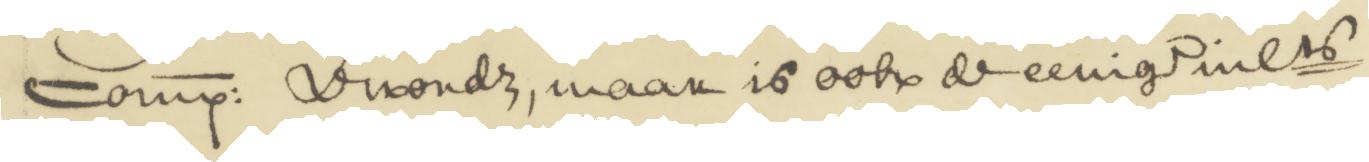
Comp: teworden, maar is ook de eenige inl=ts
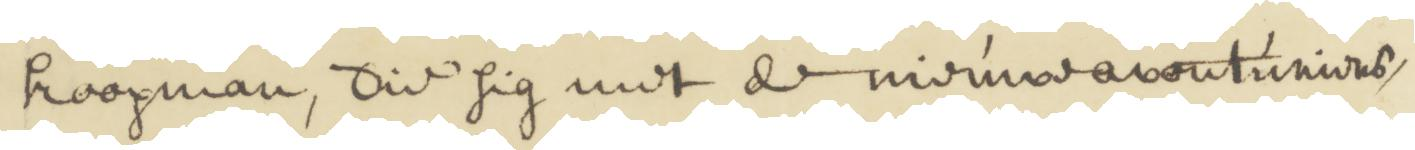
koopman, die sig met de nieuwe avonturiers,
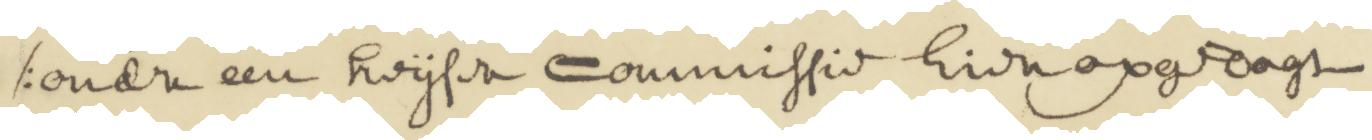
/: onder een keijser commissie hier opgedagt
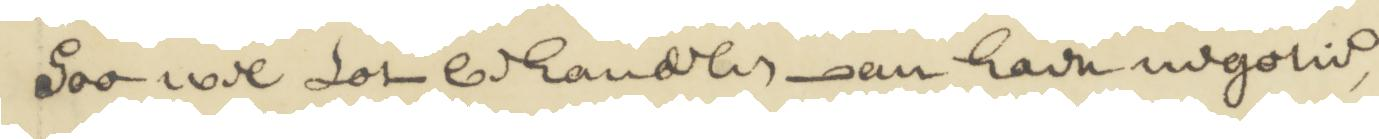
soo wel tot behandelen van haer negotie,
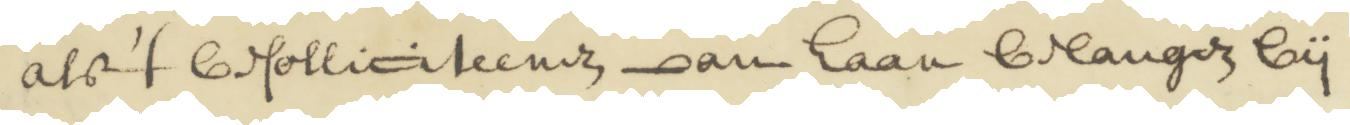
als ’t besolliciteeren van haar belangen bij
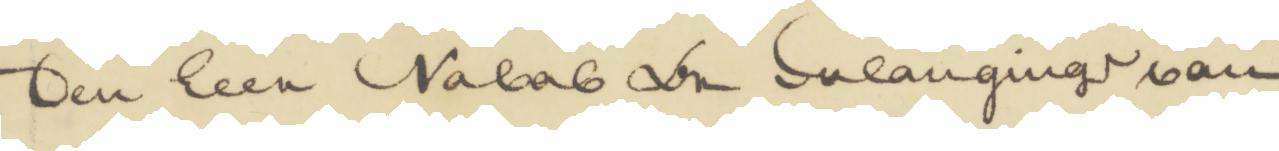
den heer Nabab ter Erlanginge van
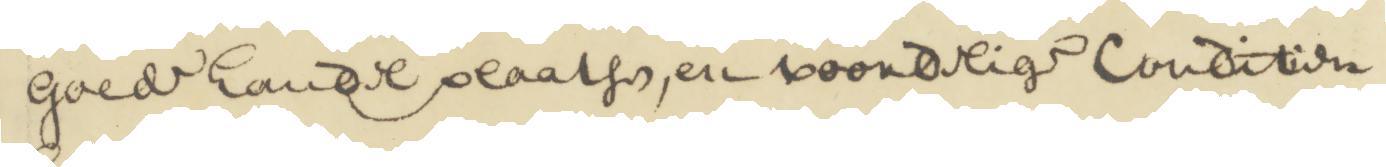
goede handel plaatsen, en voordelige Conditien
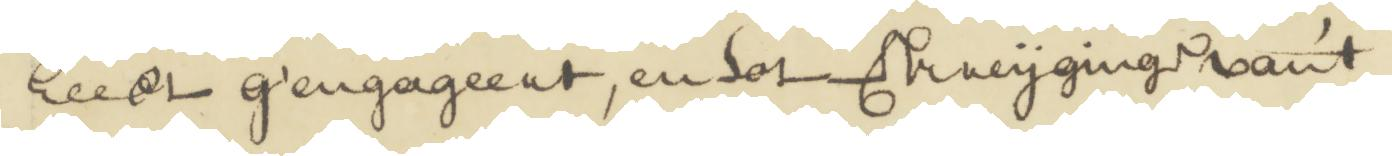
heeft g'engageert, en tot verkreijginge van’t
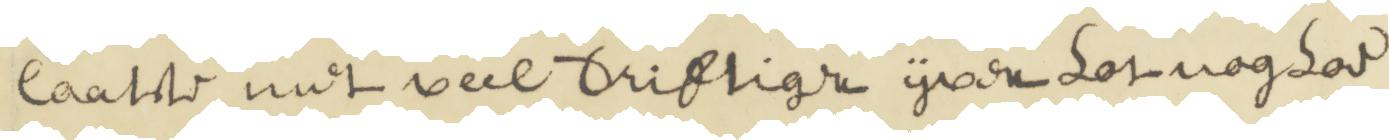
laatste met veel driftiger ijver tot nog toe
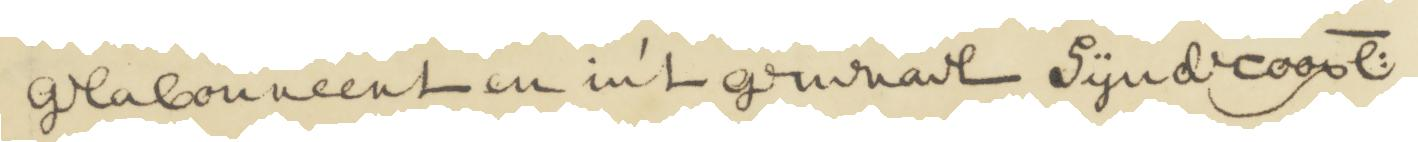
gelaboureert en in’t generael sijnde coopl:
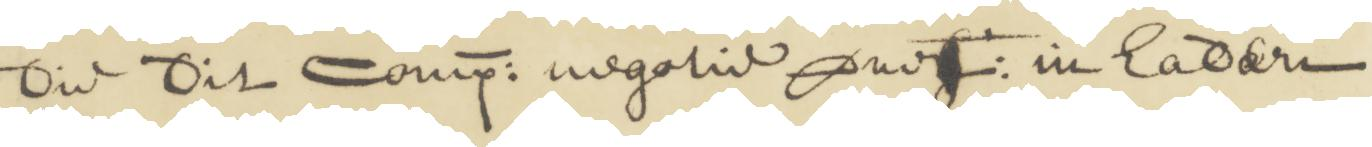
die dit Comp: negotie pres:t in hadden
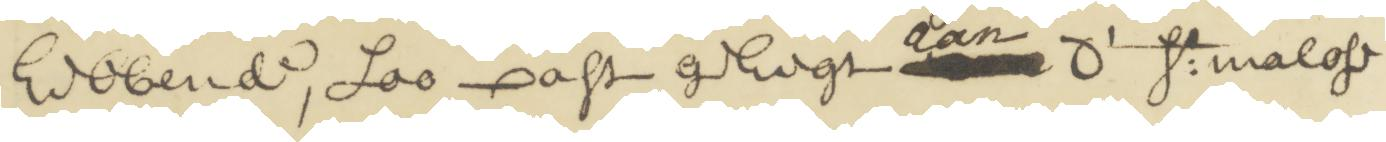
hebbende, soo vast gehegt aan d’ s:t malose
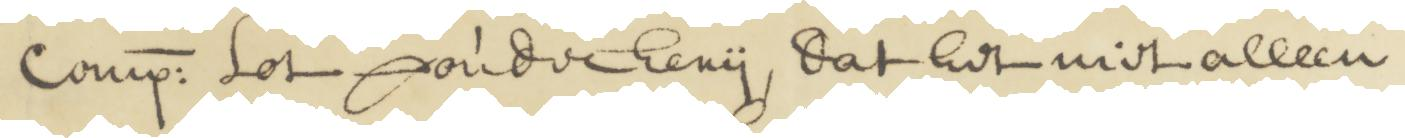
Comp: tot poudecherij, dat het niet alleen
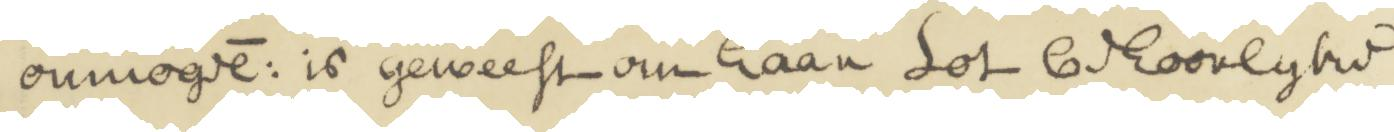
onmogel: is geweest om haar tot behoorlyke
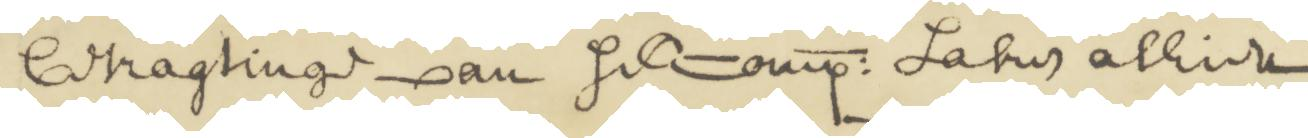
betragtinge van sEcomp: saken alhier
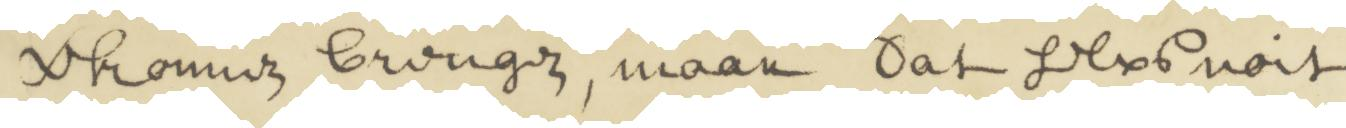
te konnen brengen, maar dat selvs noit
